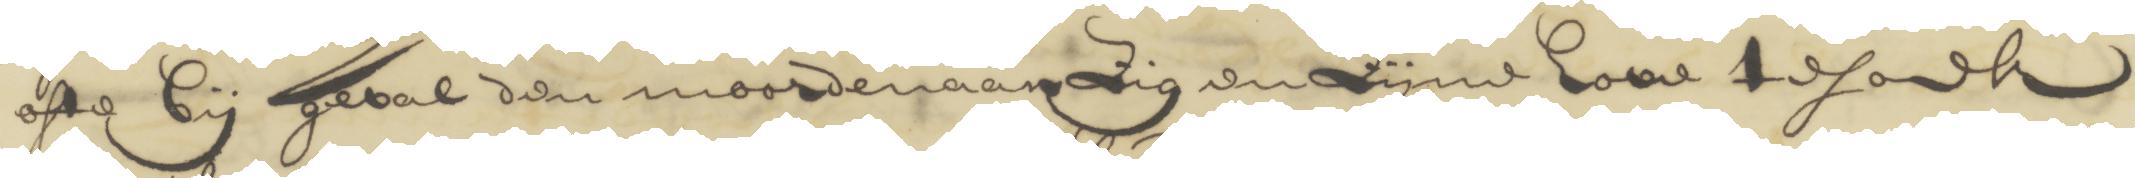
ofte bij geval den moordenaar zig en zijne hove te soek
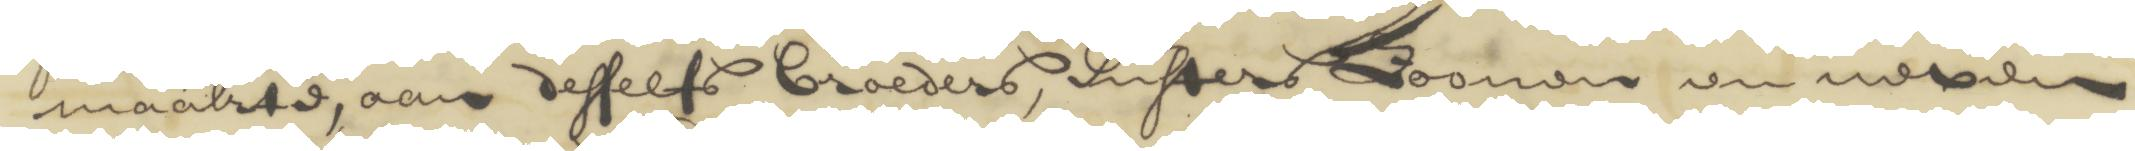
maakte, aan desselfs broeders, susters zoonen en neven
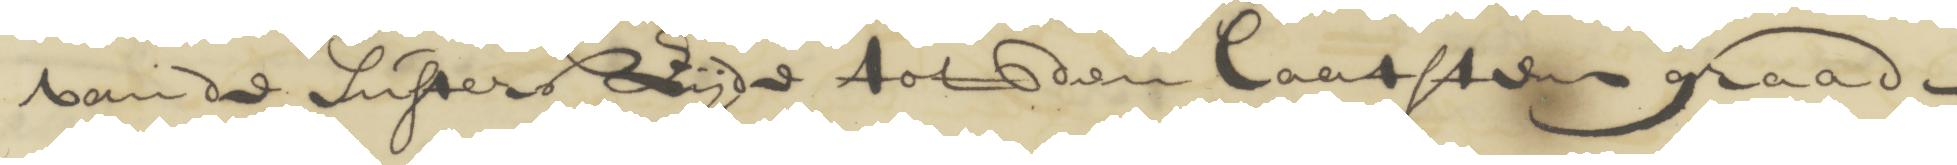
van de susters zijde tot den laatsten graad
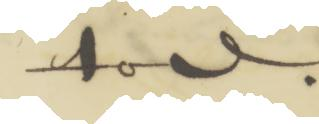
toe.
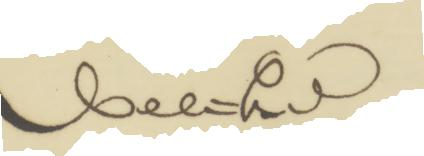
Welcke
